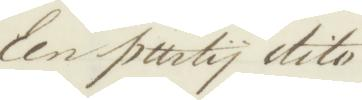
Een partij dito
